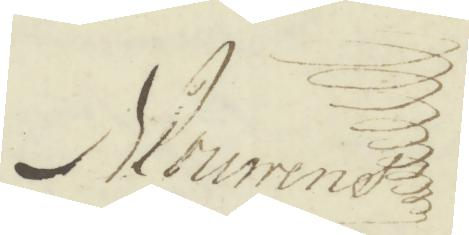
Bouwens
